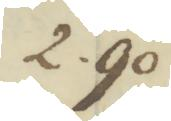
2. 90
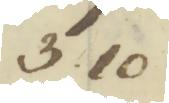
3.10
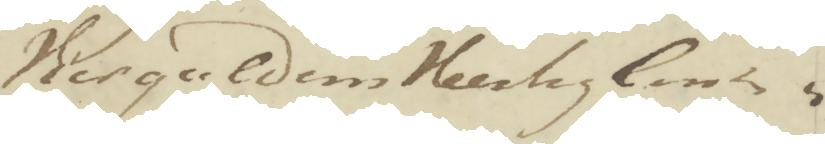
Vier guldens Veertig Cents „
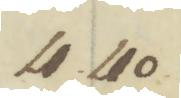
4. 40
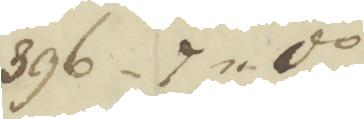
396 - 7 „ do
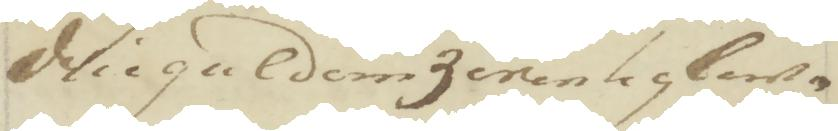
drie guldens zeventig Cents
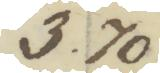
3.70
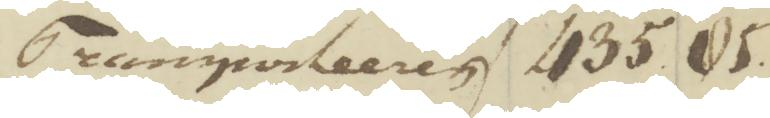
Transporteeren ƒ 435. 85
